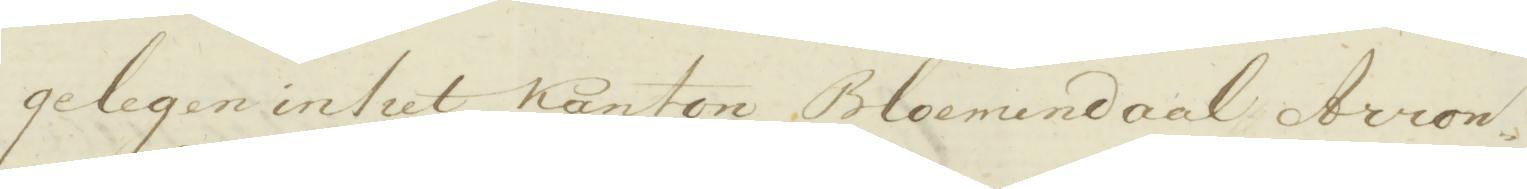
gelegen in het kanton Bloemendaal Arron„
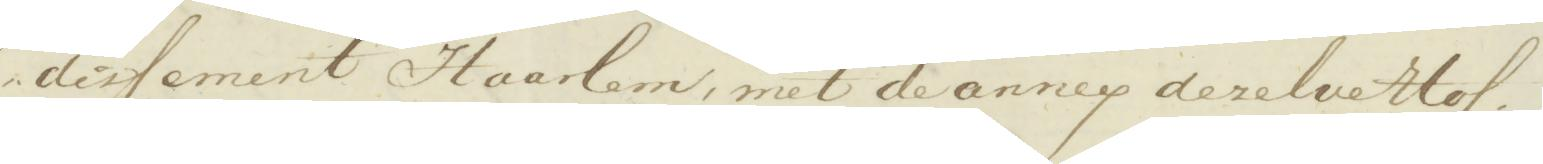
„dissement Haarlem, met de annex dezelve Hof„
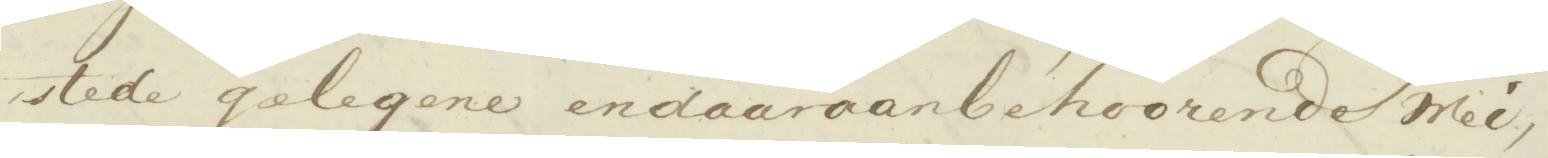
„stede gelegene en daaraanbehoorende wei,
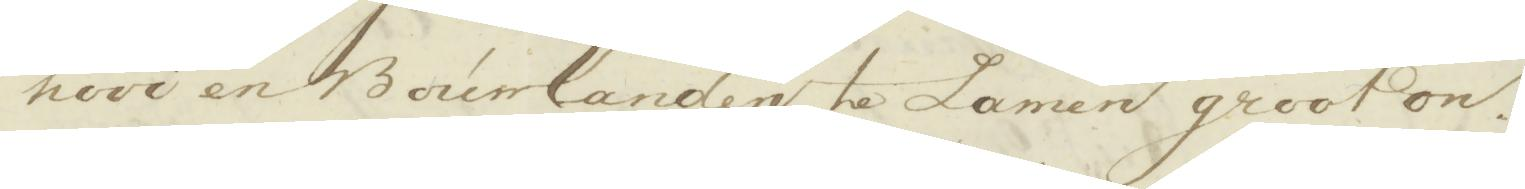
hooi en Bouwlanden, te zamen groot on„
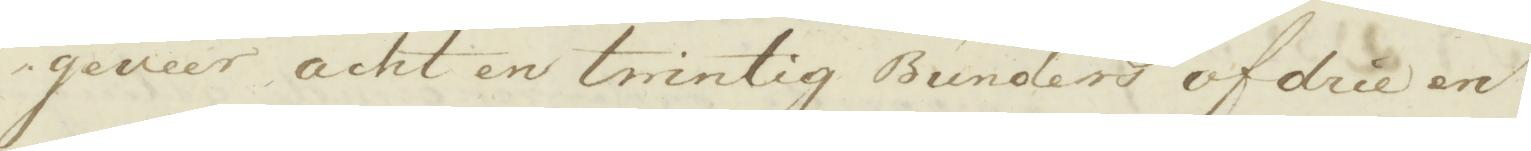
„geveer acht en twintig Bunders of drie en
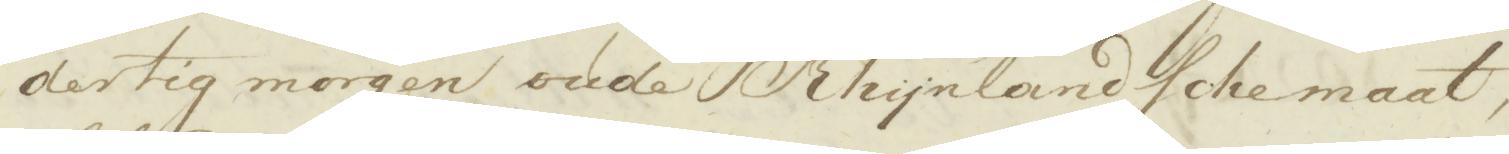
dertig morgen oude Rhijnlandschemaat,
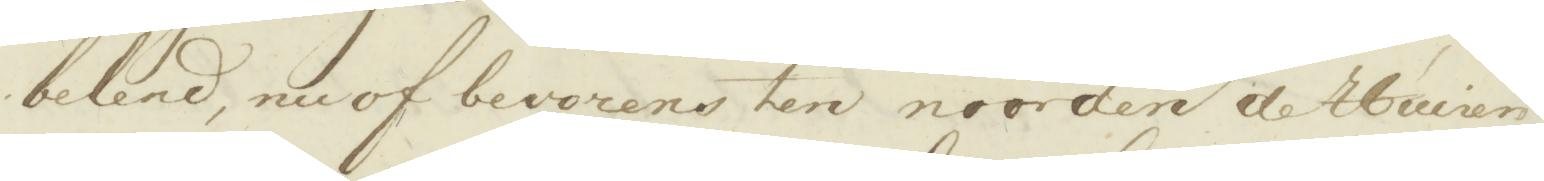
„belend, nu of bevorens ten noorden de Huizen
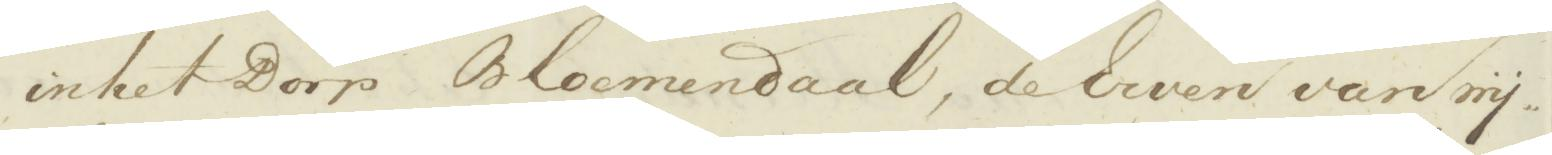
in het Dorp Bloemendaal, de Erven van wij„
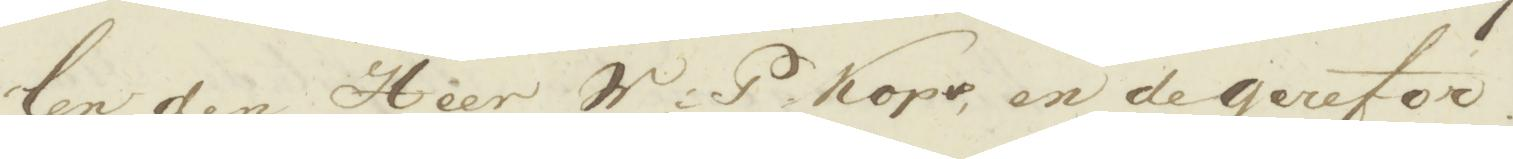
len den Heer W: P: Kops, en de gerefor„
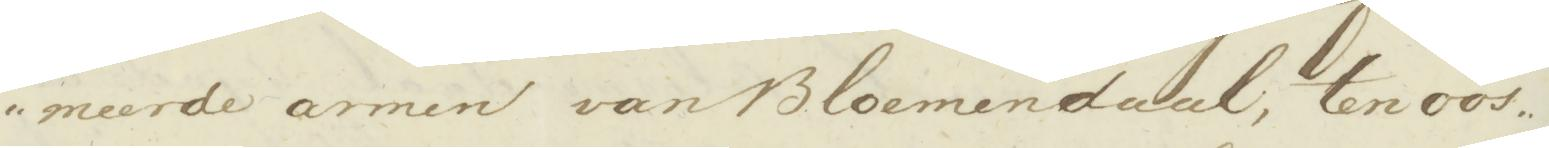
„meerde armen van Bloemendaal; ten oos„
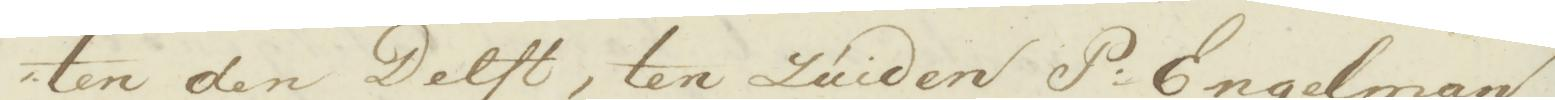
„ten den Delft, ten zuiden P: Engelman,
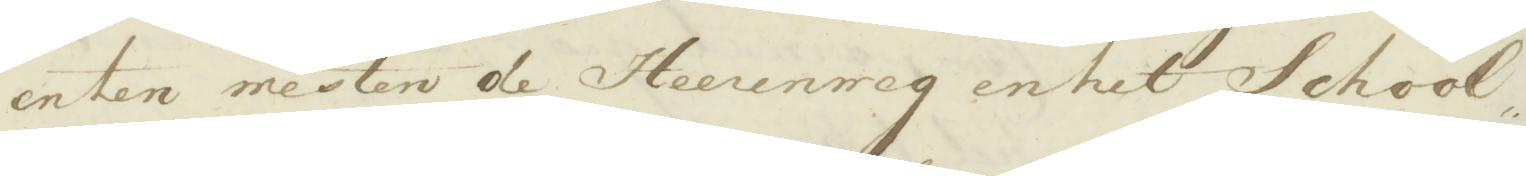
en ten westen de Heerenweg en het School„
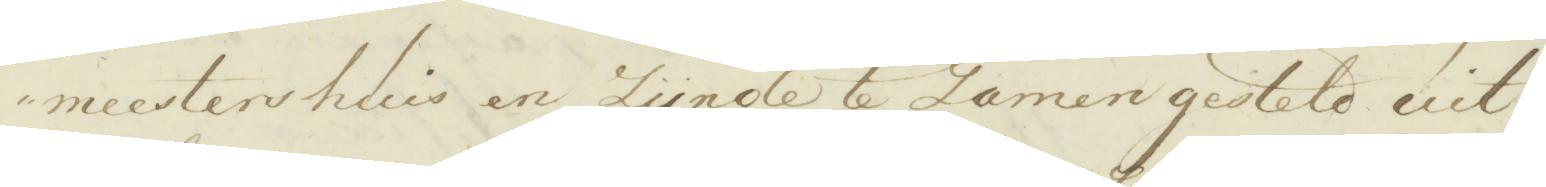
„meestershuis en zijnde te zamen gesteld uit,
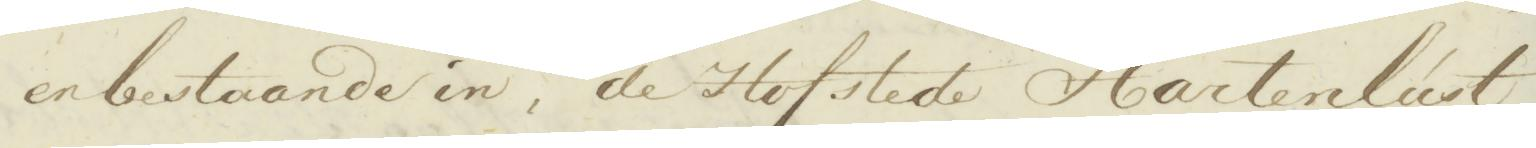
en bestaande in, de Hofstede Hartenlust,
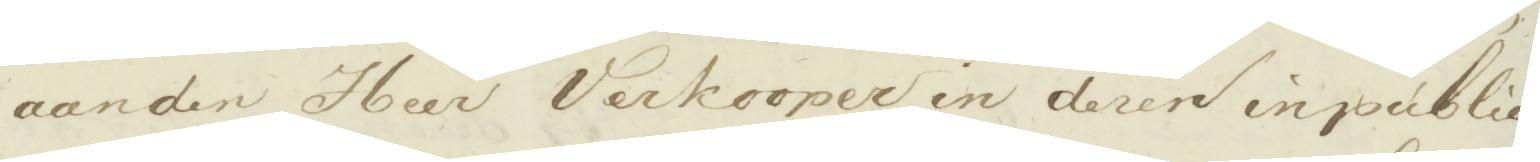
aan den Heer Verkooper in dezen in publie
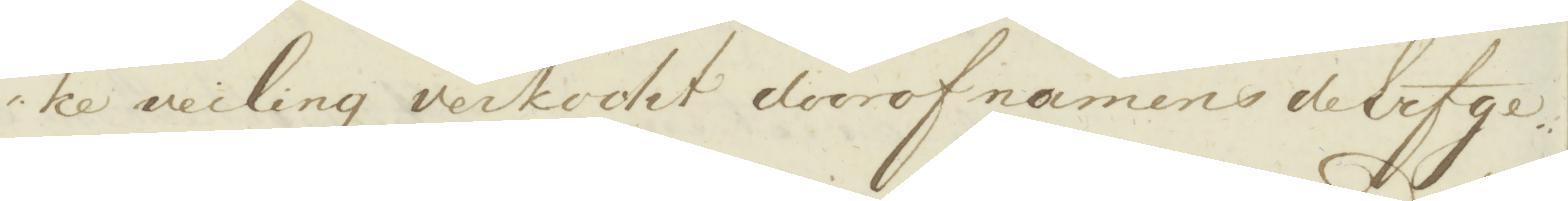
„ke veiling verkocht door of namens de Erfge„
